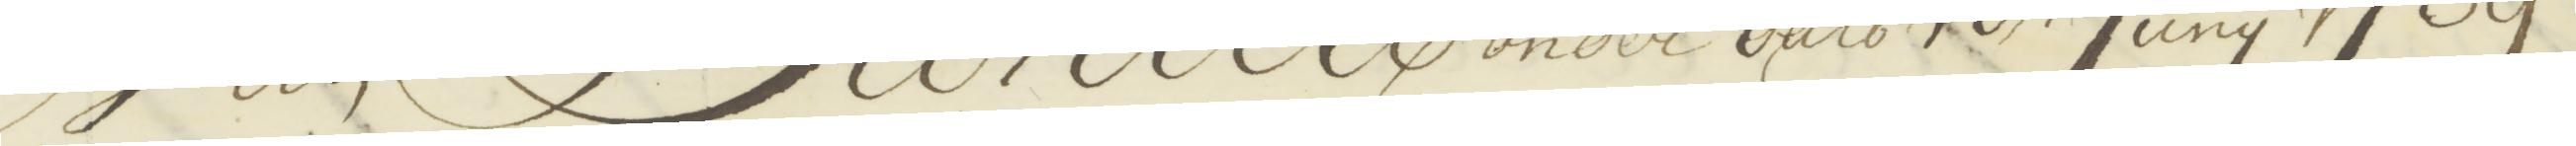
Van Banda onder dato 18: Junij 1739
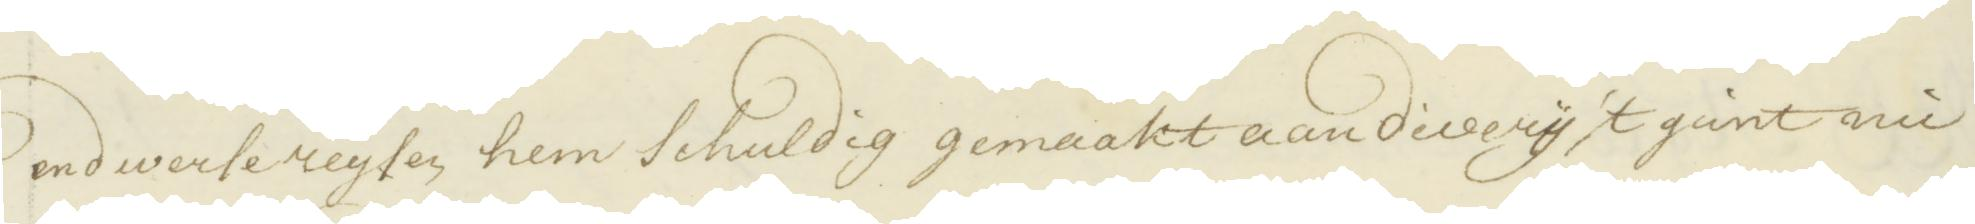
en diverse reysen hem schuldig gemaakt aan diverij ’t gunt nu
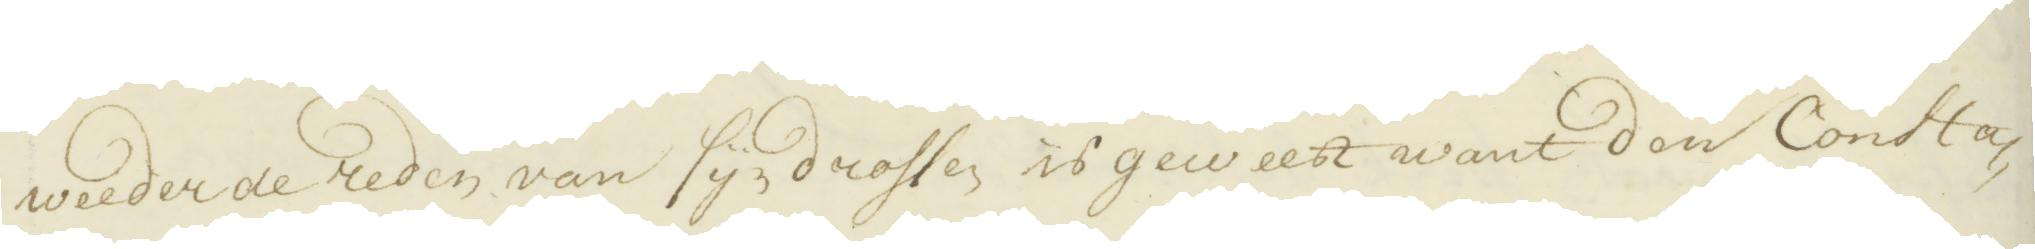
weeder de reden van sijn drossen is geweest want den Consta„
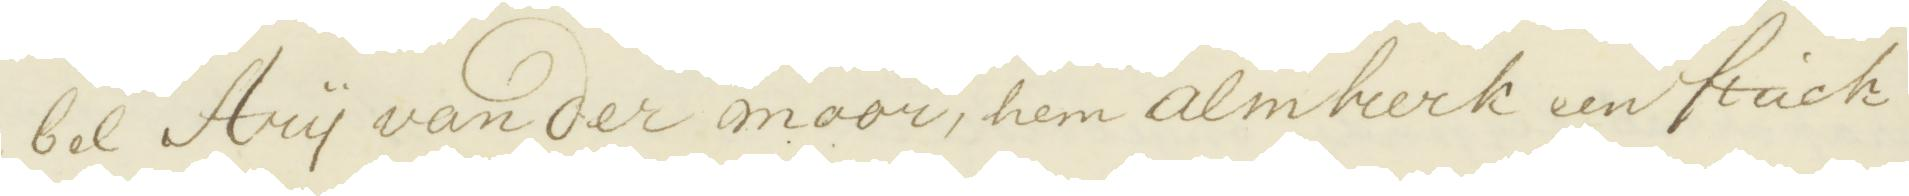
bel Arij van der moor, hem Almkerk een stuck
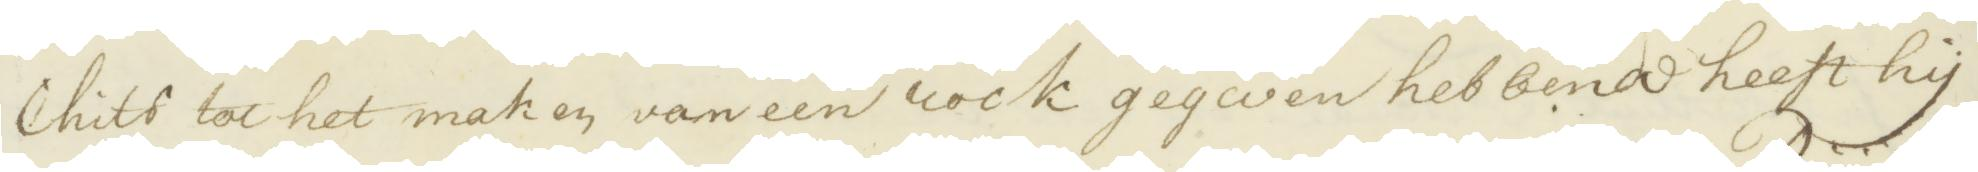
chits tot het maken van een rock gegeven hebbende heeft hij
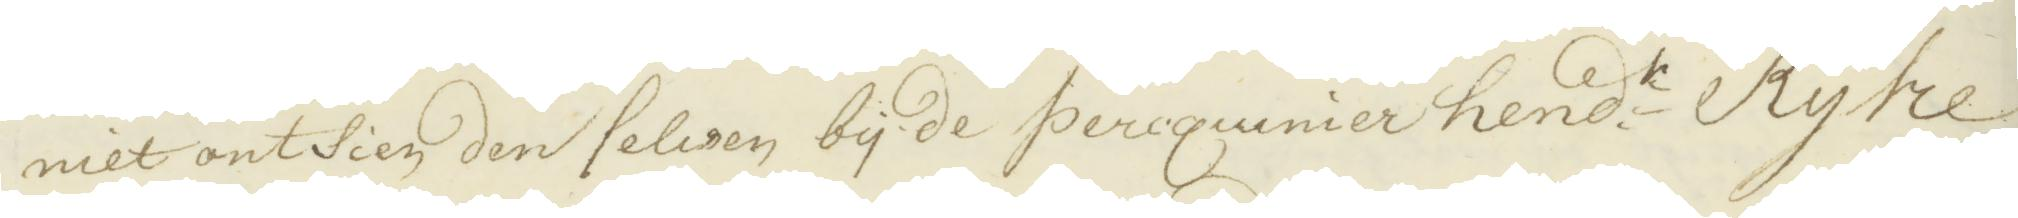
niet ontsien den selven bij de percquinier hend=k Rijke
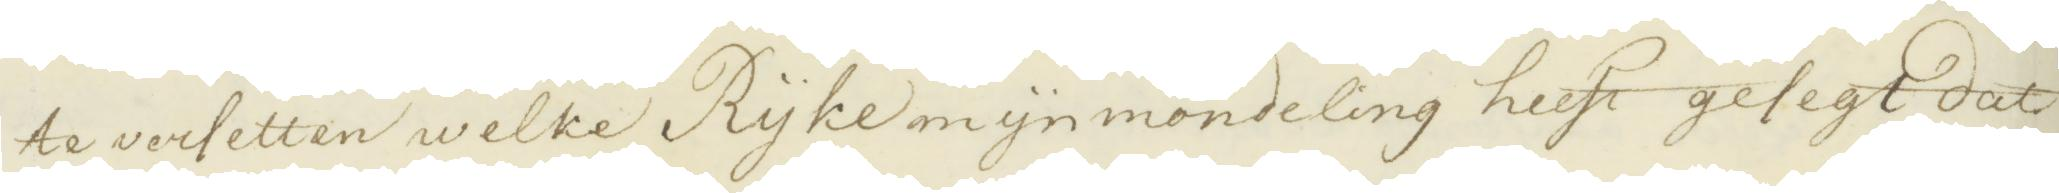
te versetten welke Rijke mijn mondeling heeft gesegt dat
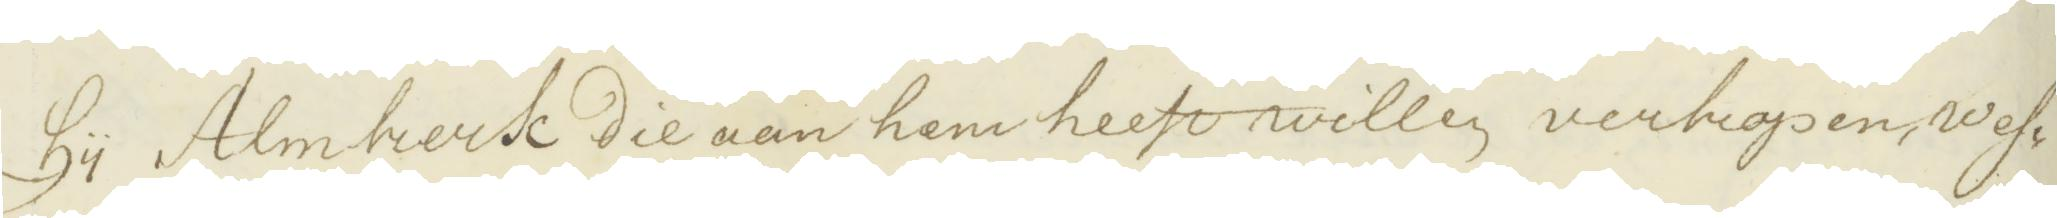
hij Almkerk die aan hem heeft willen verkopen, wes„
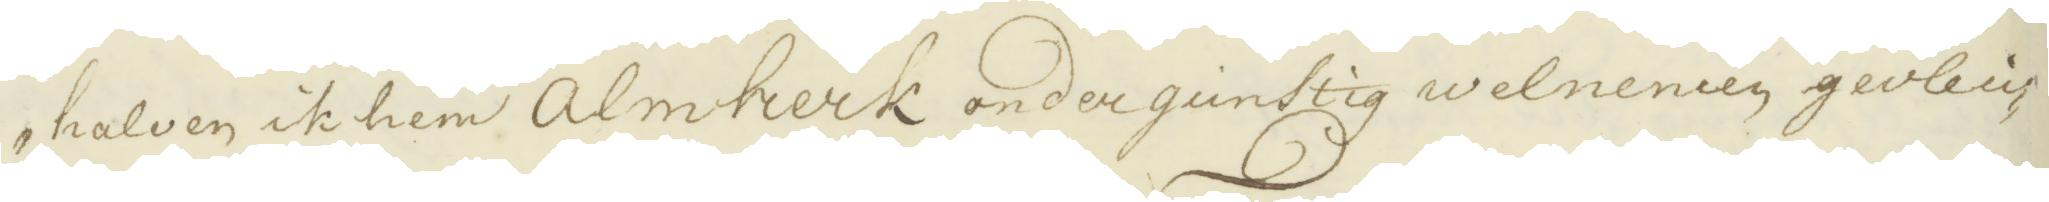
„halven ik hem Almkerk onder gunstig welnemen gevleu„
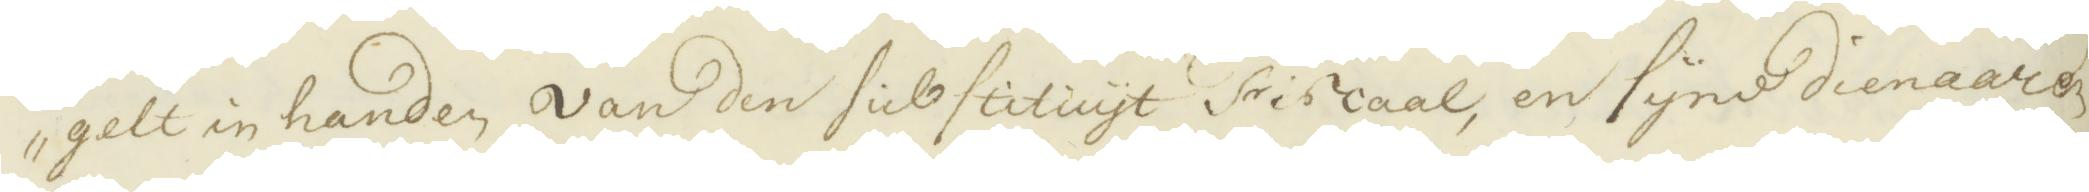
„gelt in handen van den substituijt Fiscaal, en sijne dienaaren
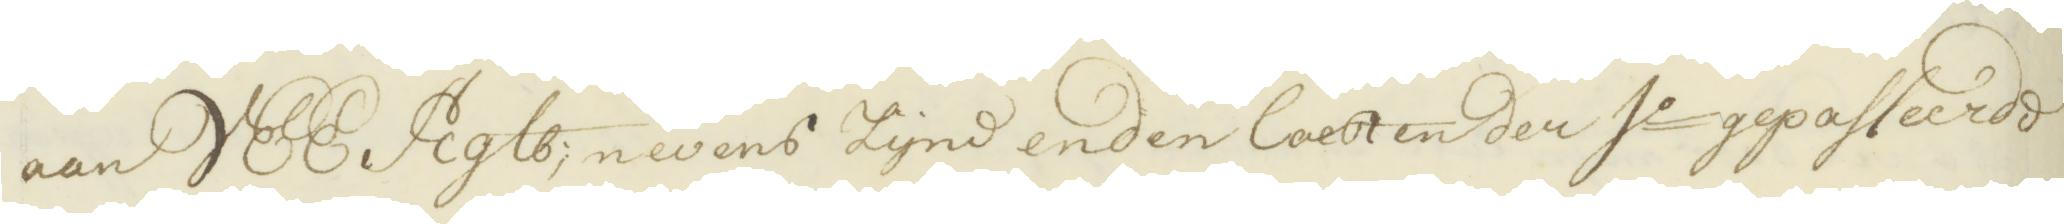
aan VEE Agtb; nevens zijne enden laesten der J=o gepasseerde
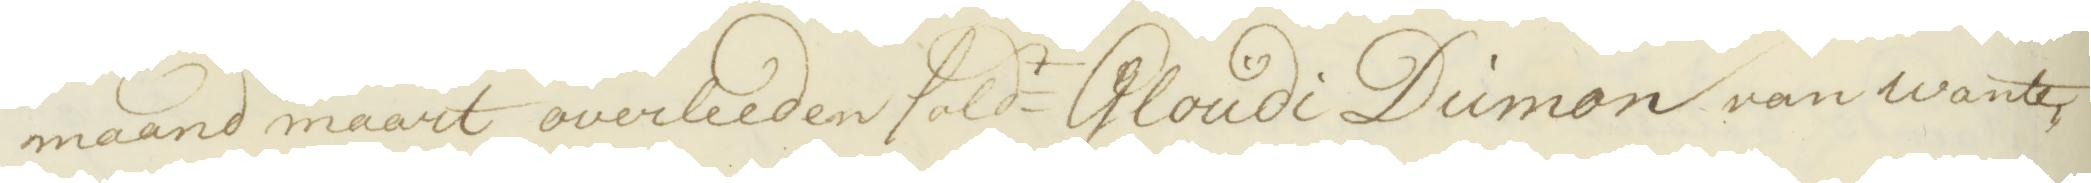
maand maart overleeden sold=t Gloudi Dumon van wante„
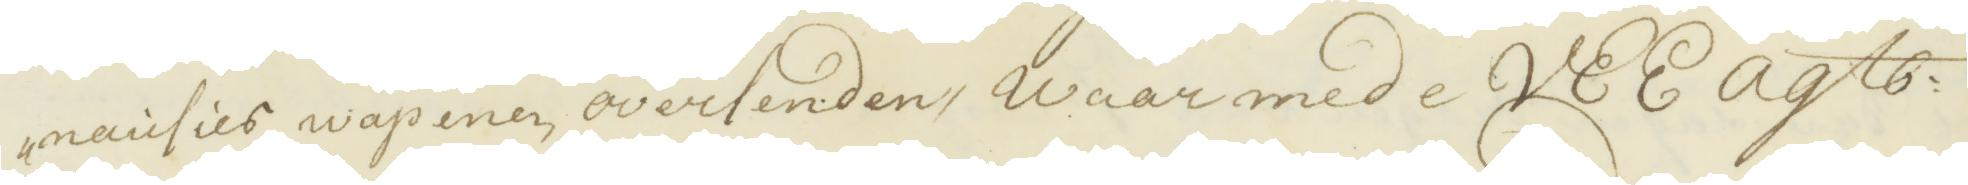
„nausies wapenen oversenden, waar mede VEE agtb:
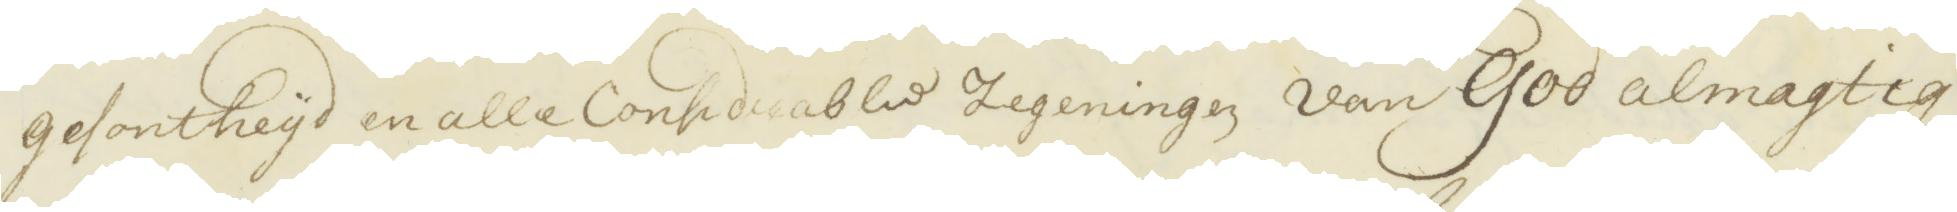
gesontheijd en alle considerablie zegeningen van God almagtig
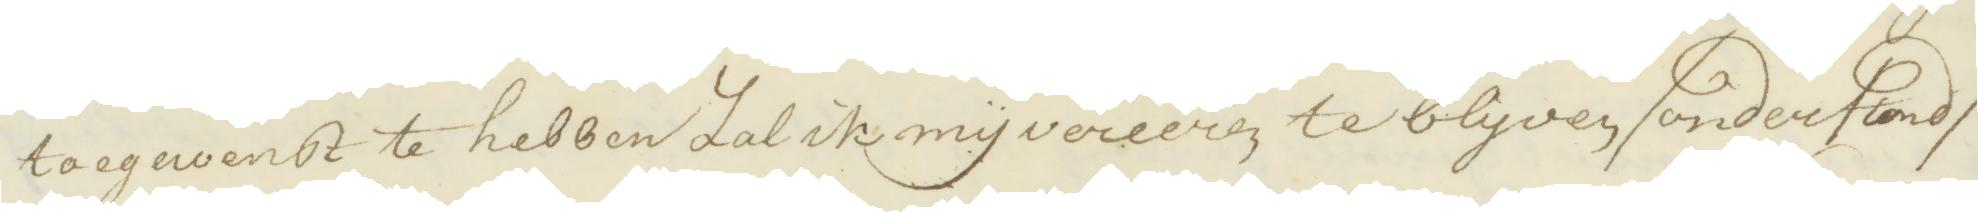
toegewenst te hebben zal ik mij vereeren te blijven / onderstond /
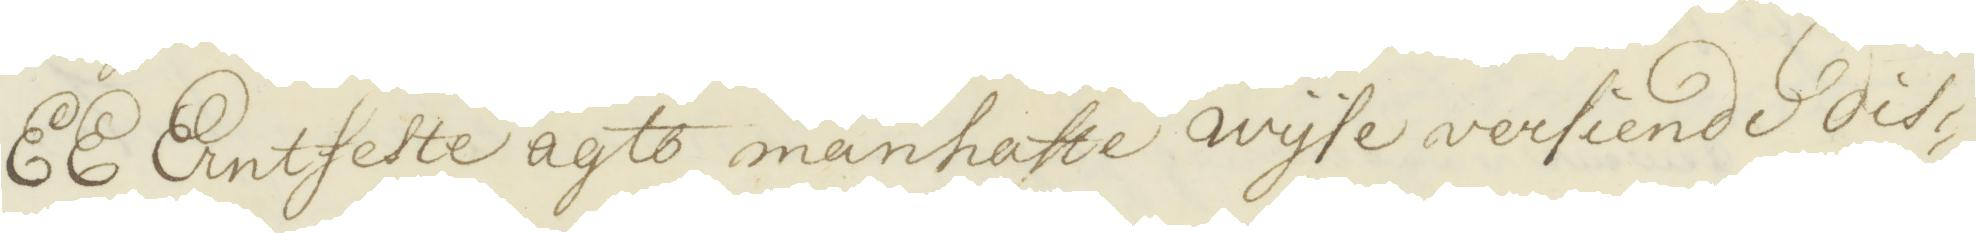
EE Erntfeste agtb manhafte wijse versiende dis„
